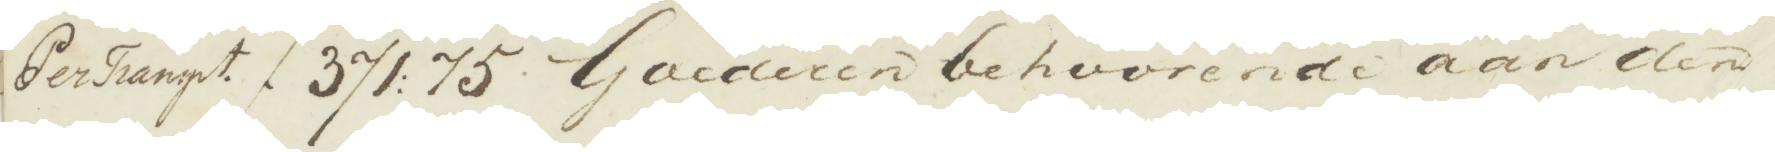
Per Transpt. ƒ 371:75. Goederen behoorende aan den
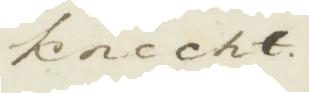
knecht.
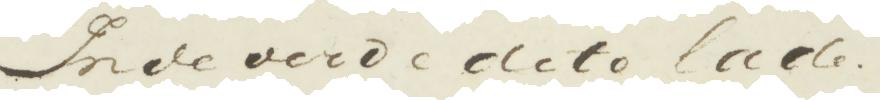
In de derde dito lade.
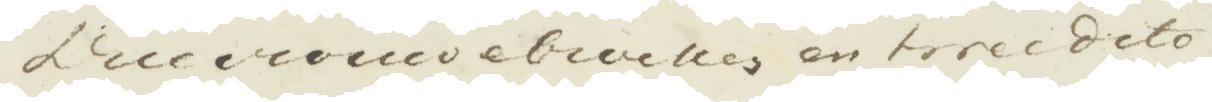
Drie vrouwe broeken en twee dito
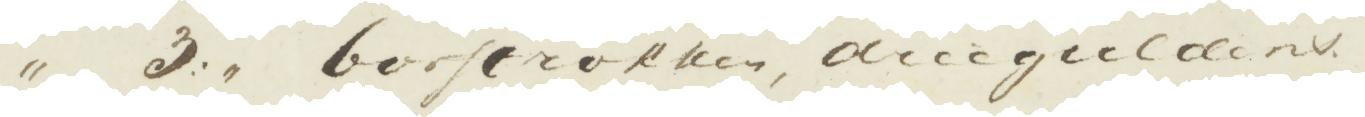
„ 3:„ borstrokken, drie guldens.
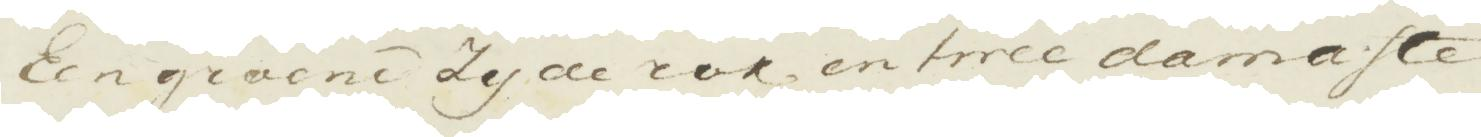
Een groene Zyde rok en twee damaste
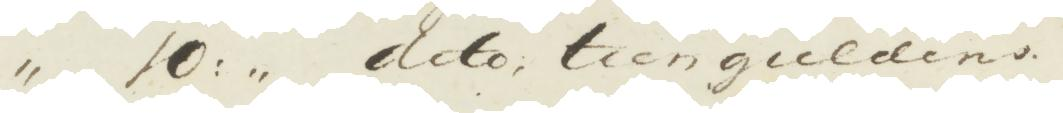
„ 10: „ dito, tien guldens.
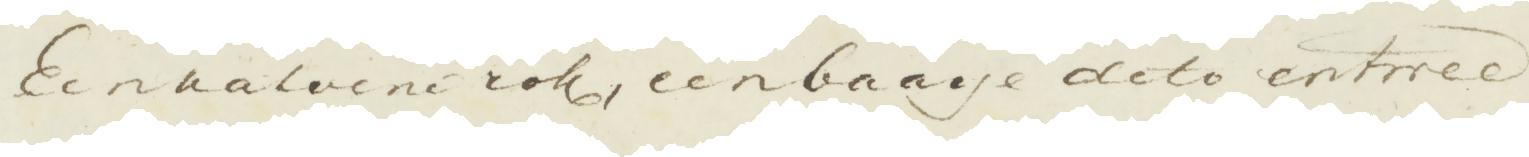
Een katoene rok, een baaye dito en twee
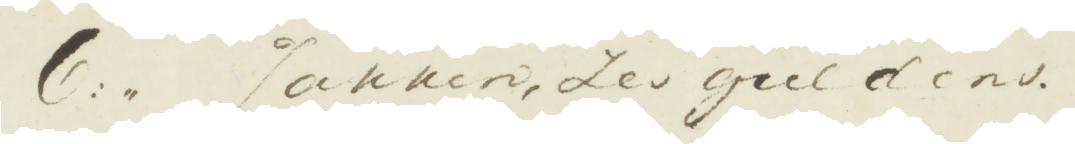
6:„ Jakken, Zes guldens.
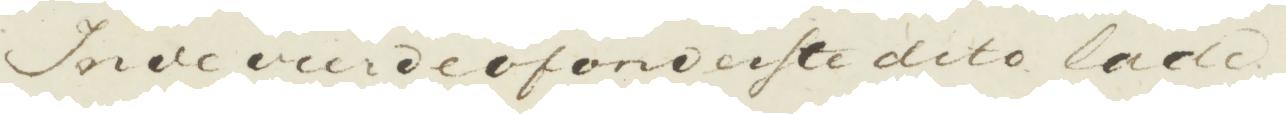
Inde vierde of onderste dito lade.
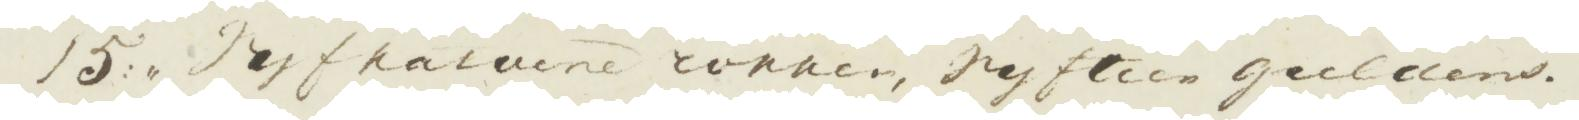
15: „ Vyf katoene rokken, vyftien guldens.
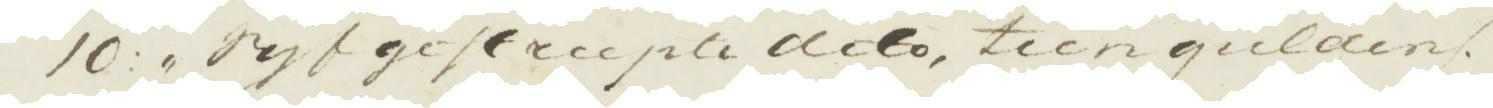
10: „ vyf gestreepte dito, tien guldens.
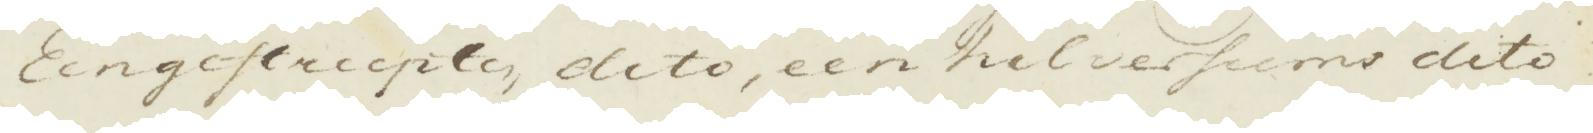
Een gestreepte, dito, een hilversums dito
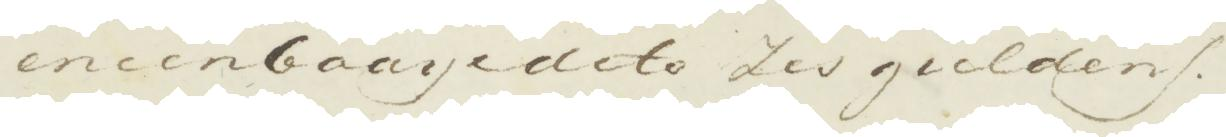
en een baaye dito Zes guldens.
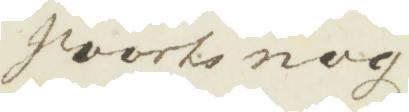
Voorts nog
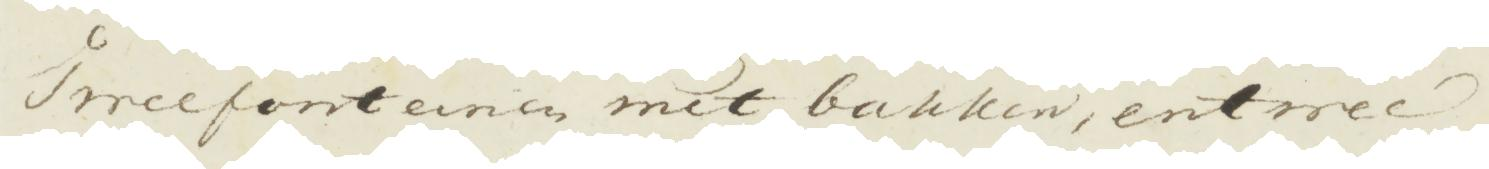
Twee fonteinen met bakken, en twee
